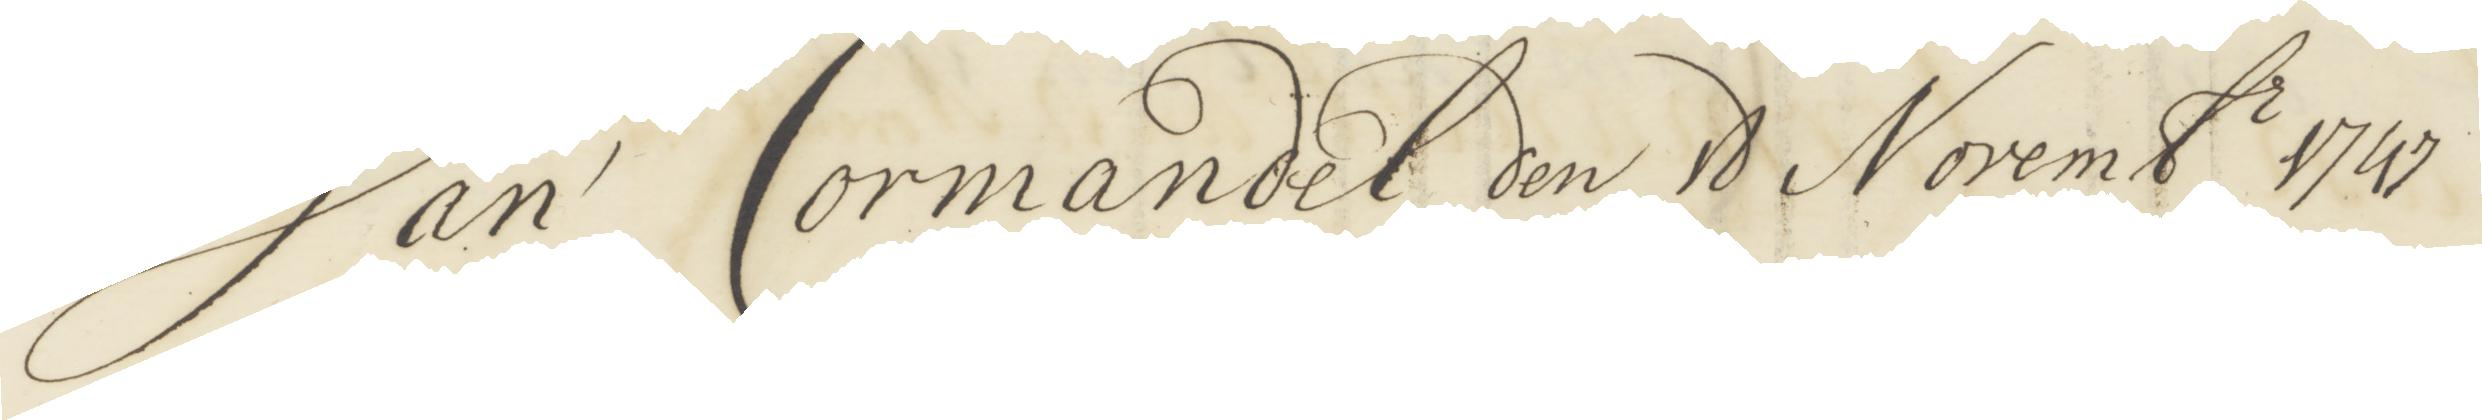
Van' Cormandel den 18 Novembr 1747
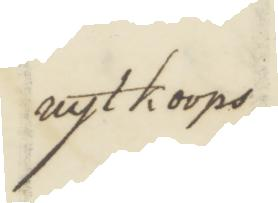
uijt koops
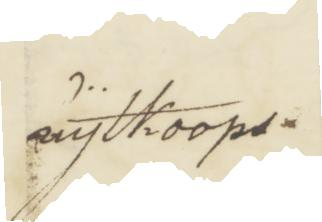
uijtkoops
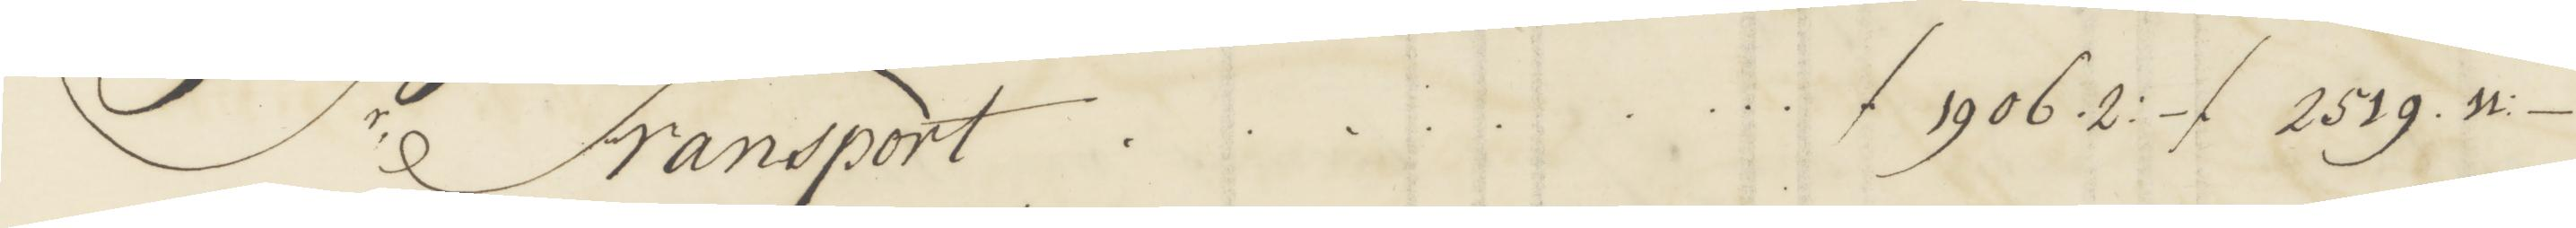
P:r Transport . . - . . . . . . ƒ 1906.2:—ƒ 2519.11:—
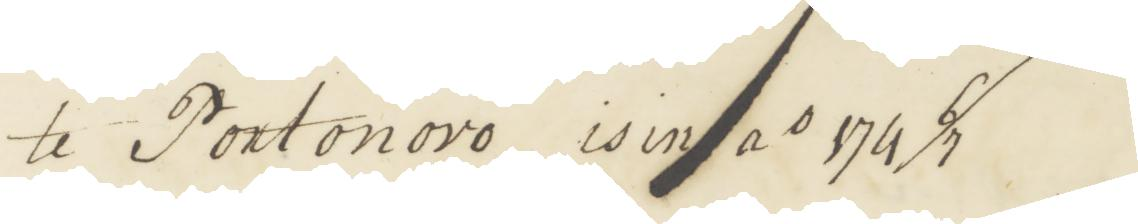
te Portonovo is in ao 174 6/7
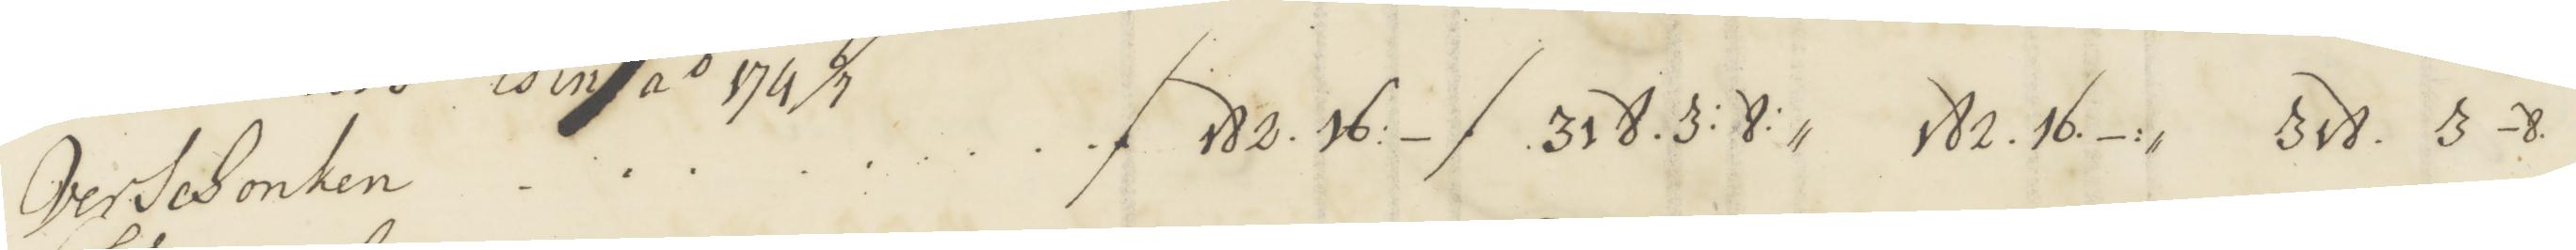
Verschonken . . . . . . . . . ƒ 182.16:— ƒ 318. 3:8:„ 182.16.—:„ 318. 3-8.
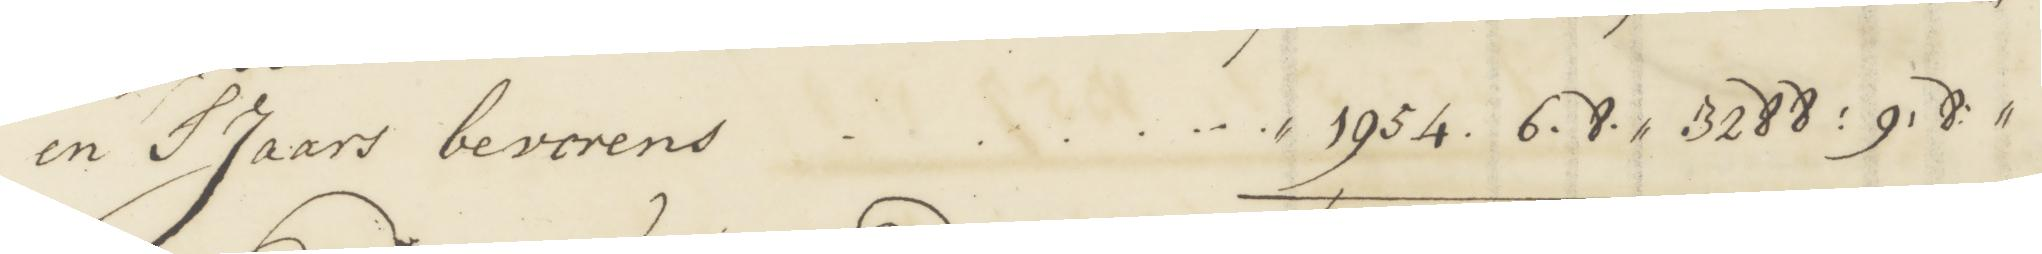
en 's Jaars bevorens . . . . . - . „1954. 6. 8.„ 3288: 9: 8: „
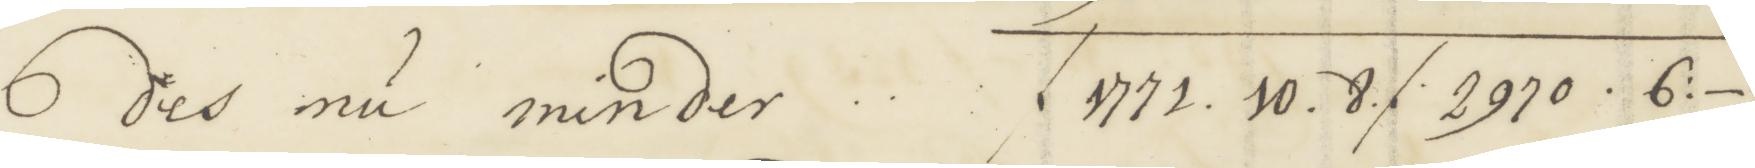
des nu minder . . : ƒ1772. 10. 8. ƒ 2970. 6:—
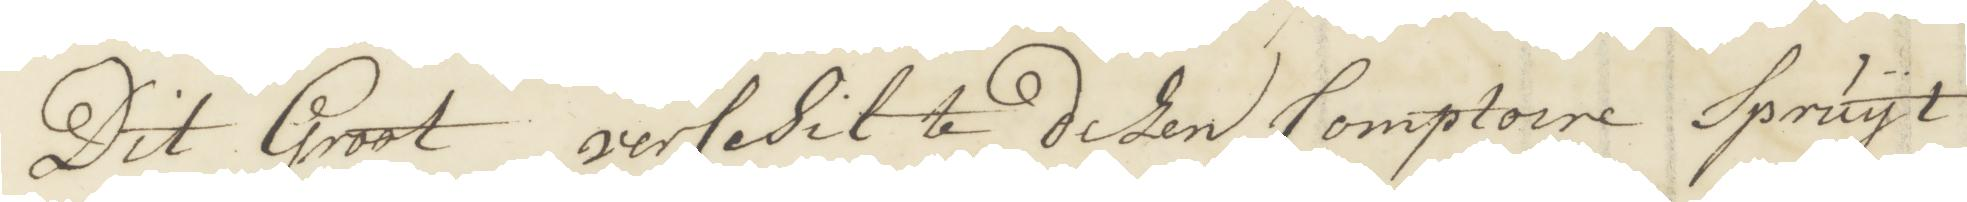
Dit Groot verschil te dezen Comptoire spruijt
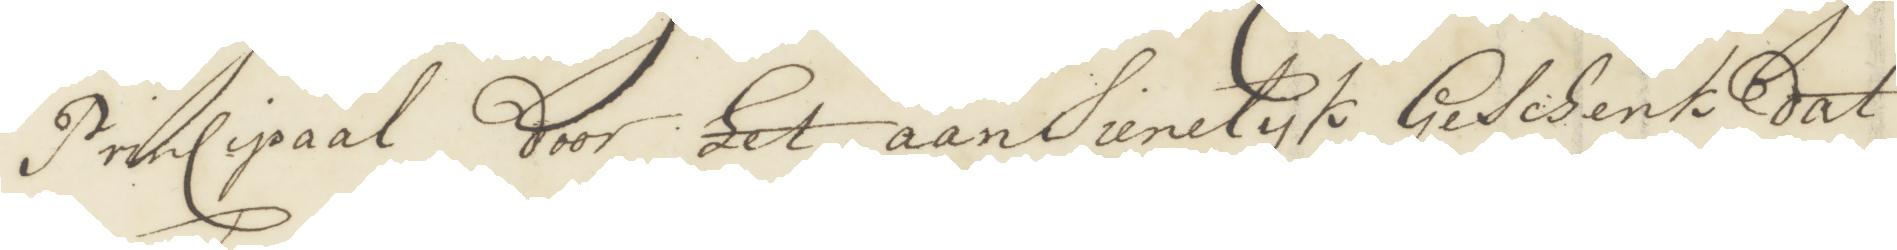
Principaal door het aansienelijk Geschenk dat
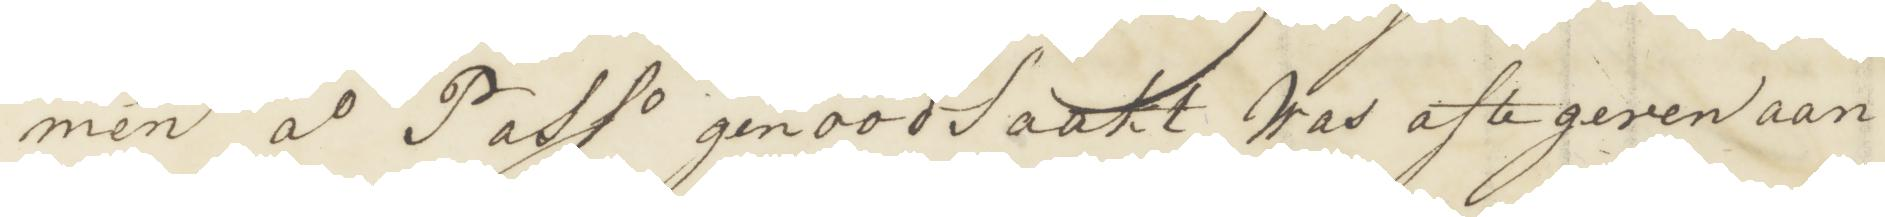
men ao Passo genoodsaakt was af te geven aan
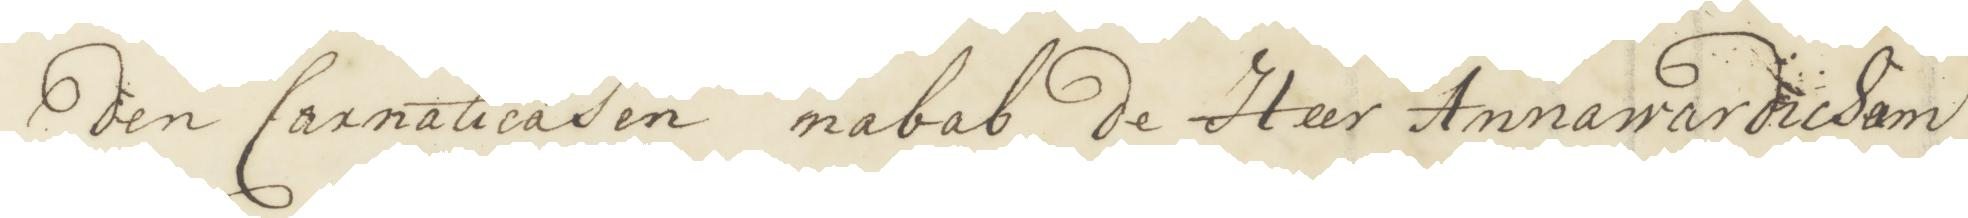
den Carnaticasen nabab de Heer Annawardicsam
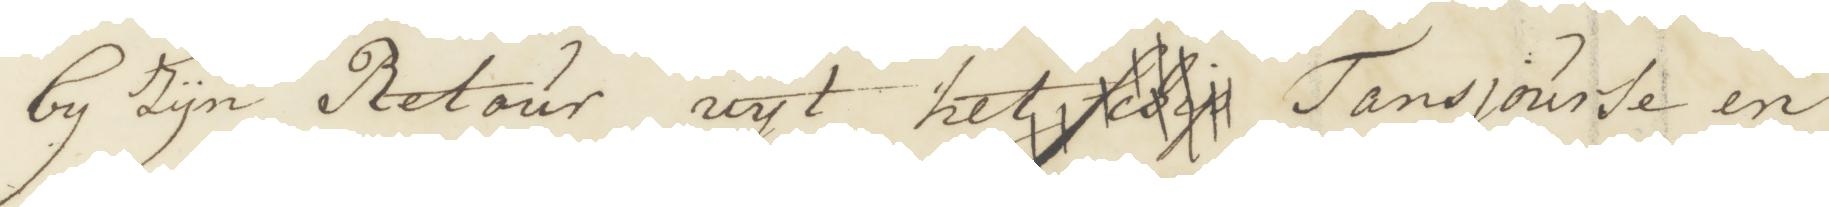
bij zijn Retour uijt het schip Tansjourse en
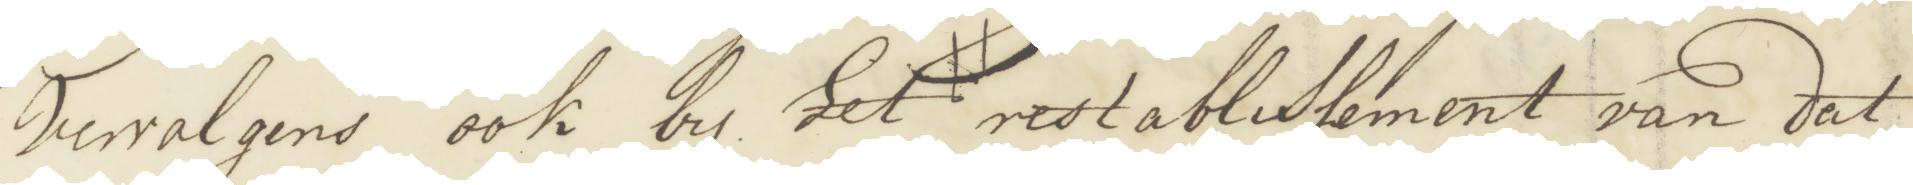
vervolgens ook bij het restablissement van dat
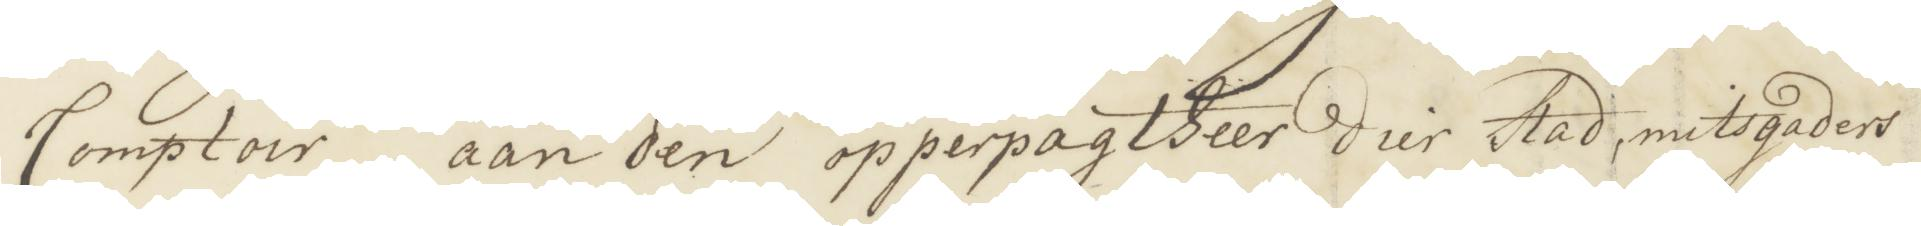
Comptoir aan den opperpagtheer dier stad, mitsgaders
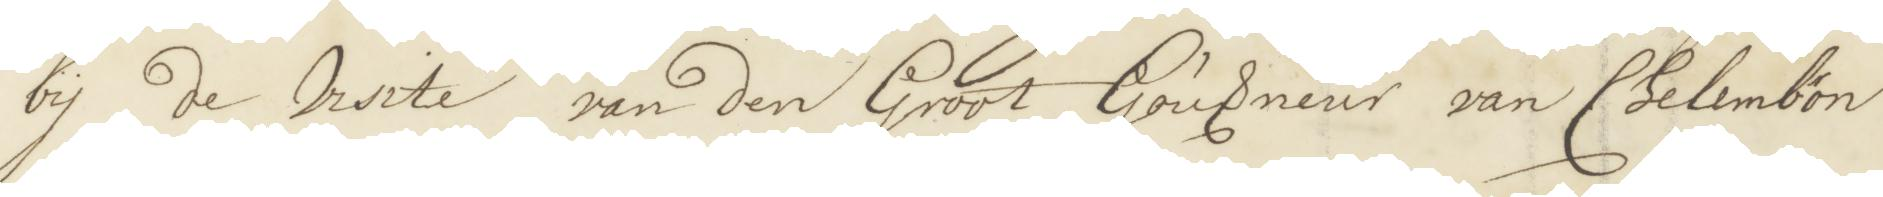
bij de visite van den Groot Gouverneur van Chelembon
